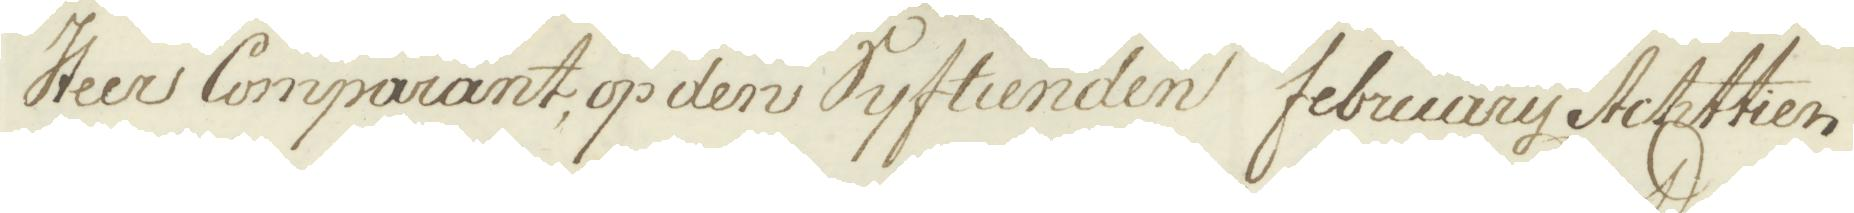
Heer Comparant, op den Vyftienden february Achttien
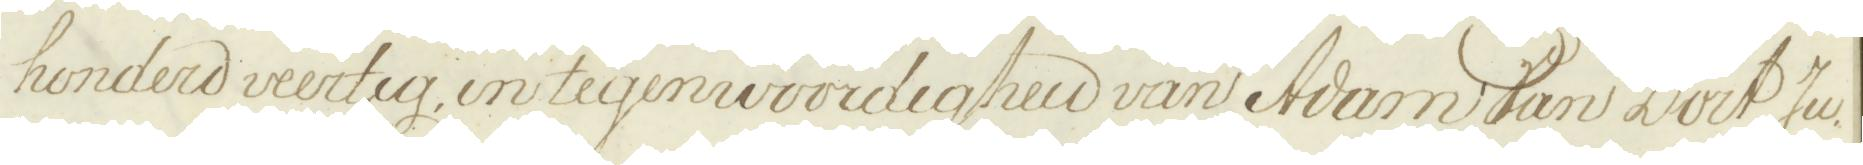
honderd veertig, in tegenwoordigheid van Adam van Dort Ju,
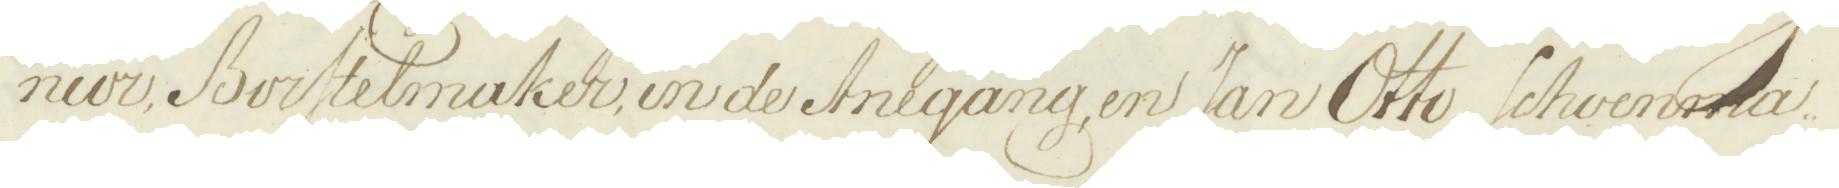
nior, Borstelmaker, in de Anegang, en Jan Otto Schoenma„
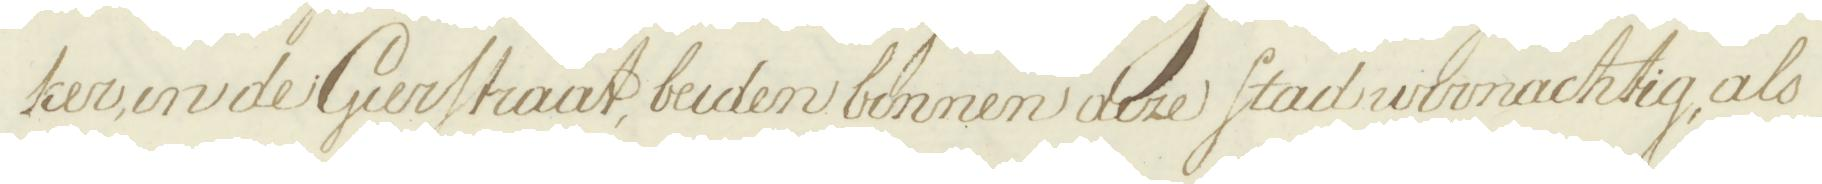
ker, in de Gierstraat, beiden binnen deze Stad woonachtig, als
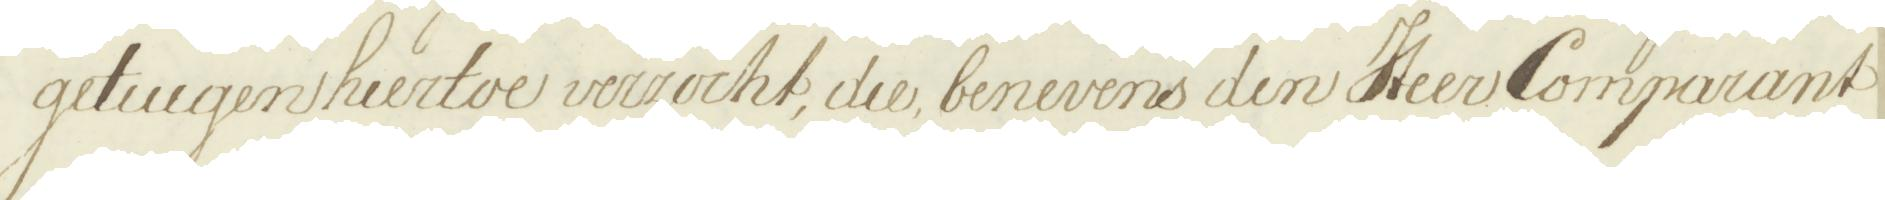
getuigen hiertoe verzocht, die benevens den Heer Comparant
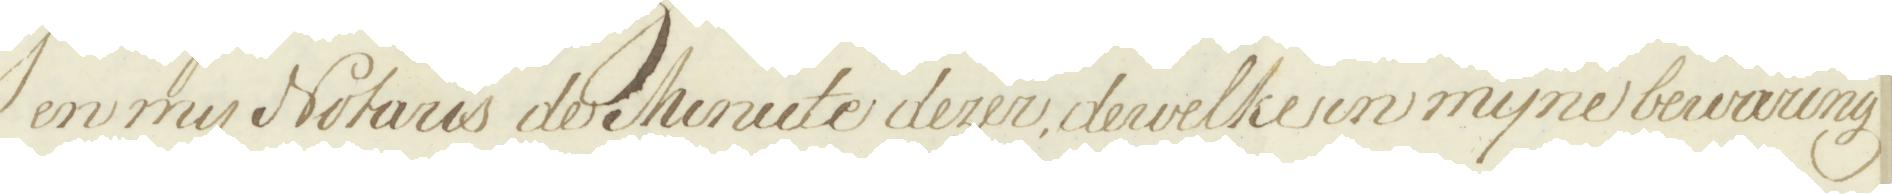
en my Notaris de Minute dezer, dewelke in myne bewaring
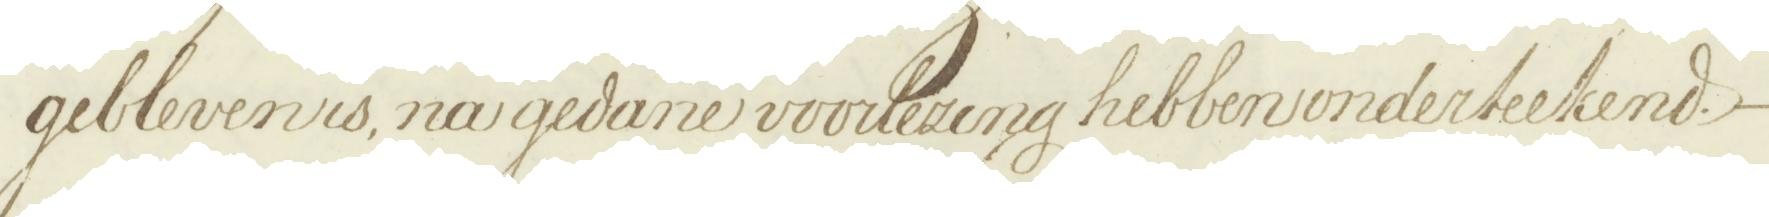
gebleven is, na gedane voorlezing hebben onderteekend.
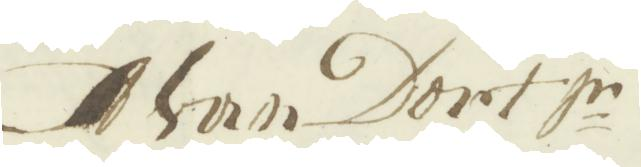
A Van Dort jr:
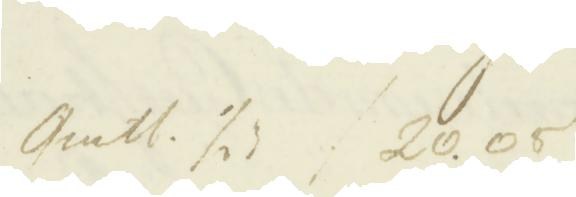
Quitt. ½ 'ƒ 20.05
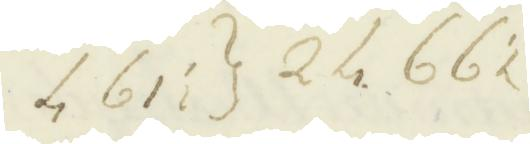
461: } 24.66 ½
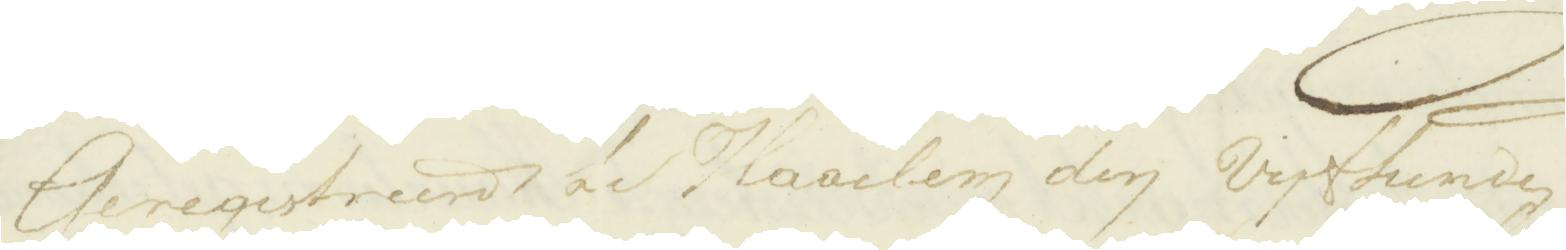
Geregistreerd te Haarlem den vyftienden
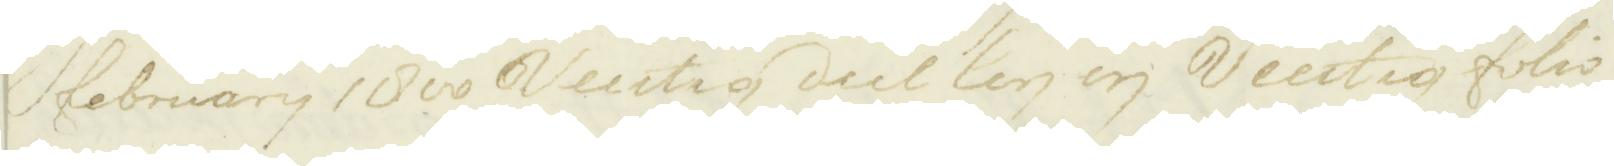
february 1800 Veertig deel Een en Veertig folio
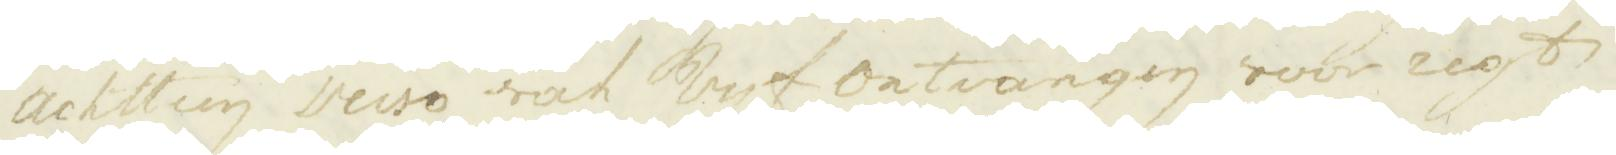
achttien verso vak Vyf ontvangen voor regt
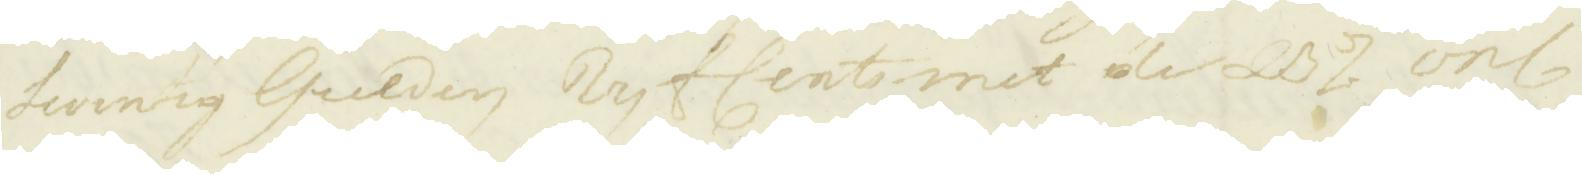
twinntig Gulden vyf Cent met de 23% opC
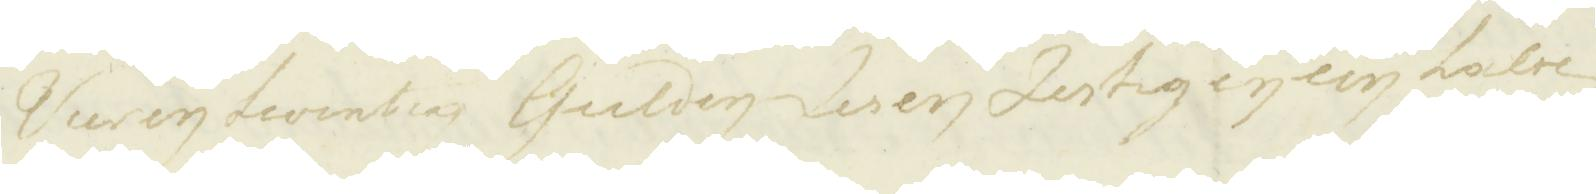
Vier en twintig Gulden Zes en Zestig en een halve
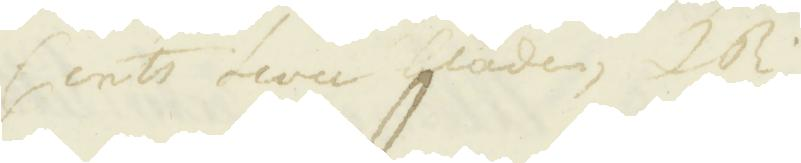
Cents twee bladen, ZR
